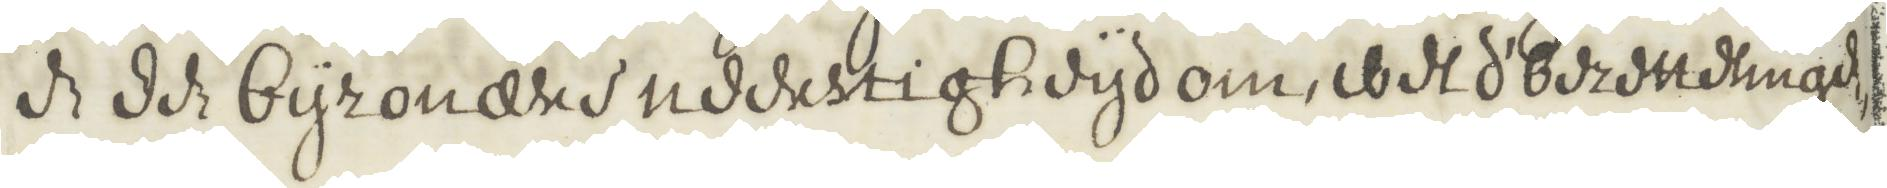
en een bijzondere neerstigheijd om, wel d’ bezettelingen,
